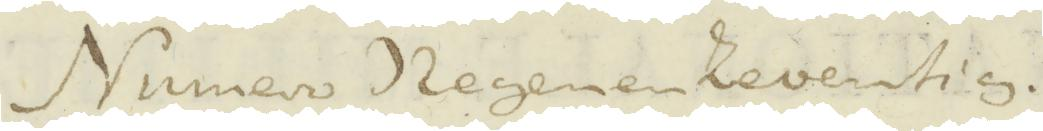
Numero Negen en Zeventig.
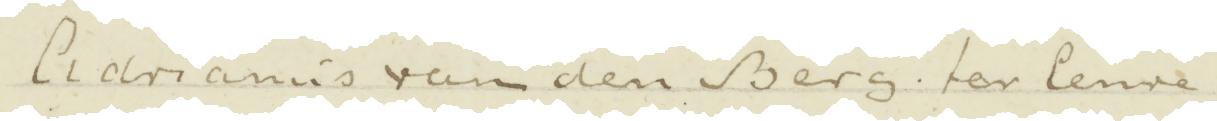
Adrianus van den Berg, ter Eenre
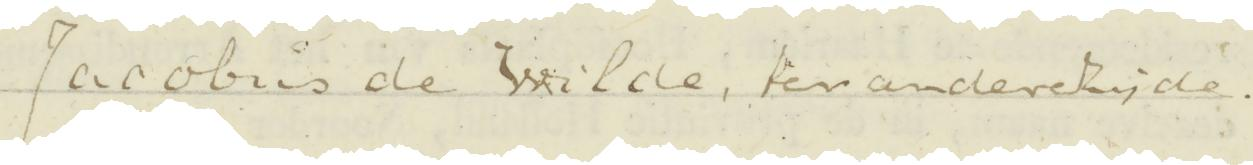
Jacobus de Wilde, ter andere zijde
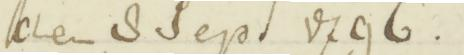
den 8 Sept 1796.
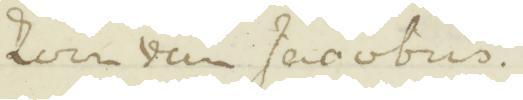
Zoon van Jacobus.
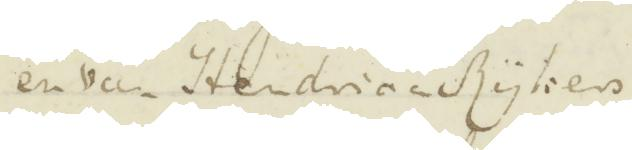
en van Hendrica Rijkers
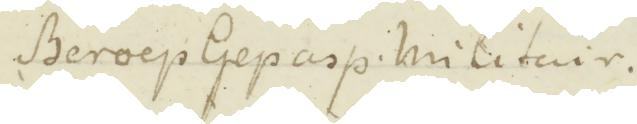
Beroep Gepasp: Militair
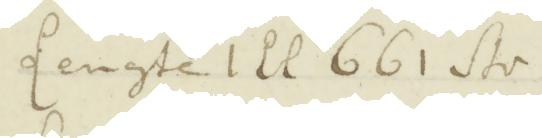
Lengte 1 El 661 str
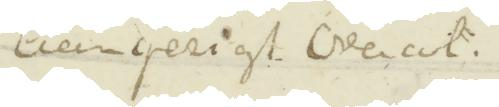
Aangezigt Ovaal.
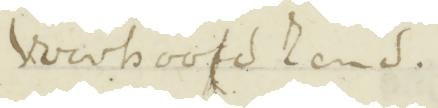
Voorhoofd Rond.
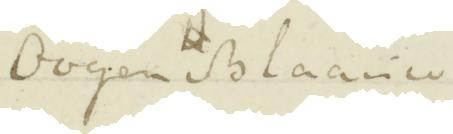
Oogen Blaauw
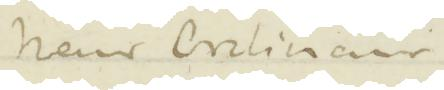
Neus Ordinair
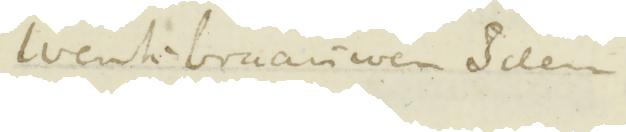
Wenkbraauwen Idem
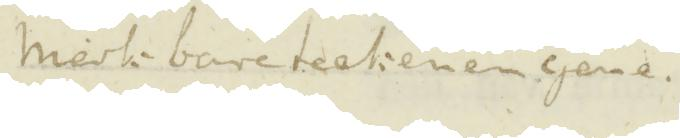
Merkbare teekenen gene.
